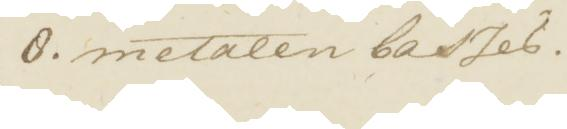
8. metalen basjes.
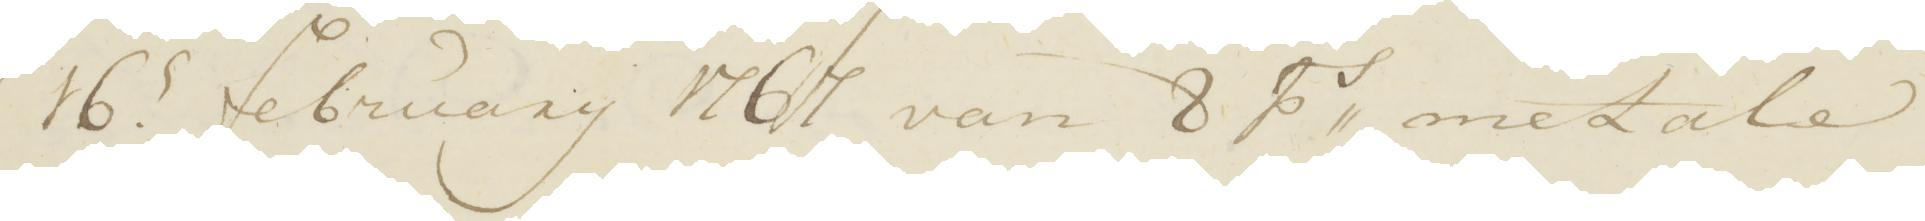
16.' februarij 1767 van 8 p„s metale
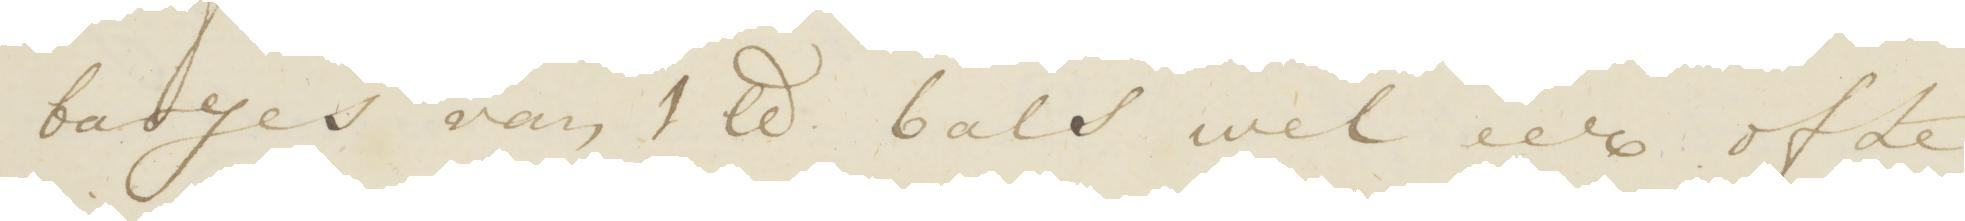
basjes van 1 ld bals wel eer of te
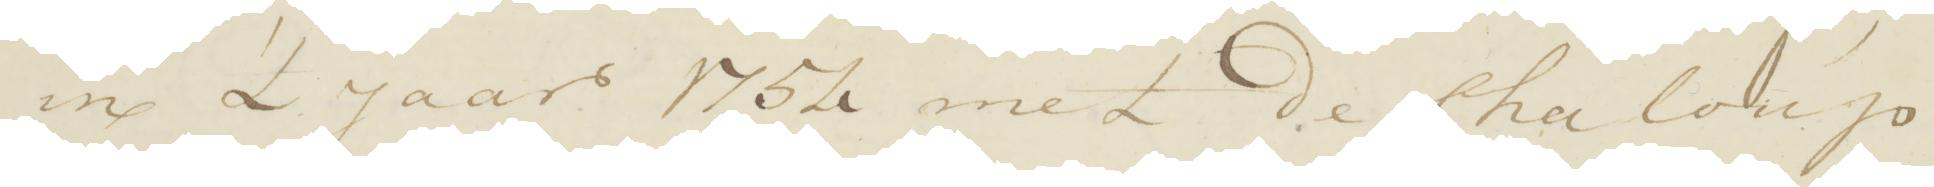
in 't jaar 1754 met de chaloup
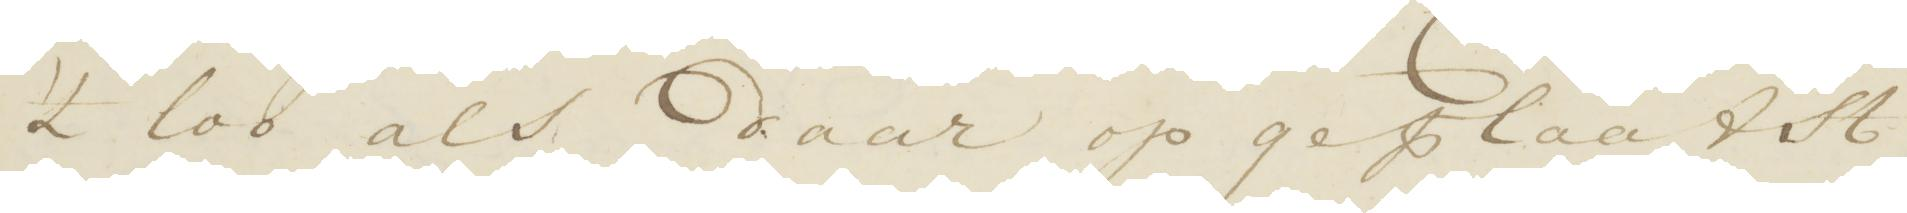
’t loo als daar op geplaatst
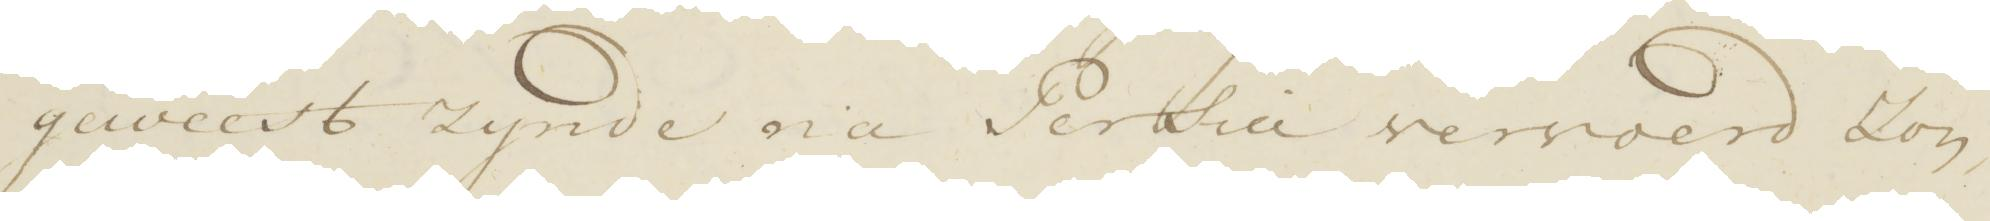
geweest zynde na Persia verroerd zon„
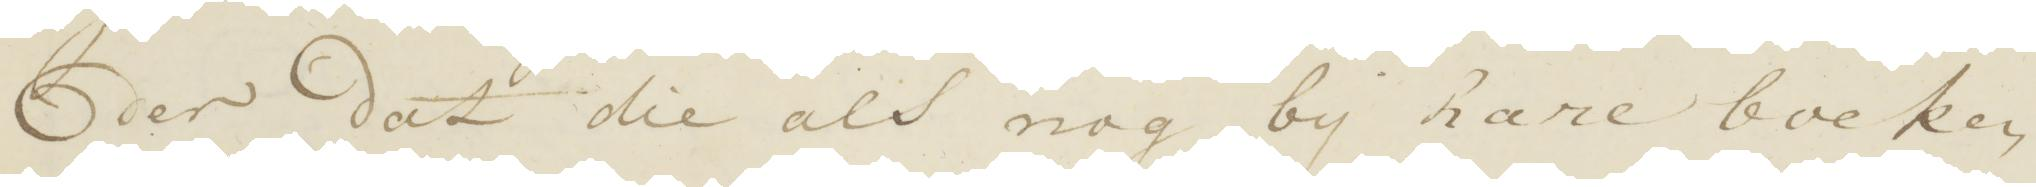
der dat die als nog bij hare boeken
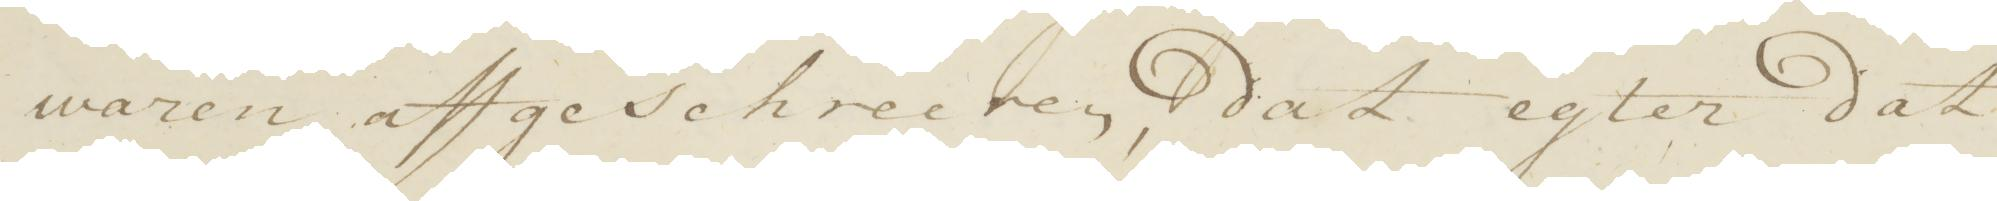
waren affgeschreeven, dat egter dat
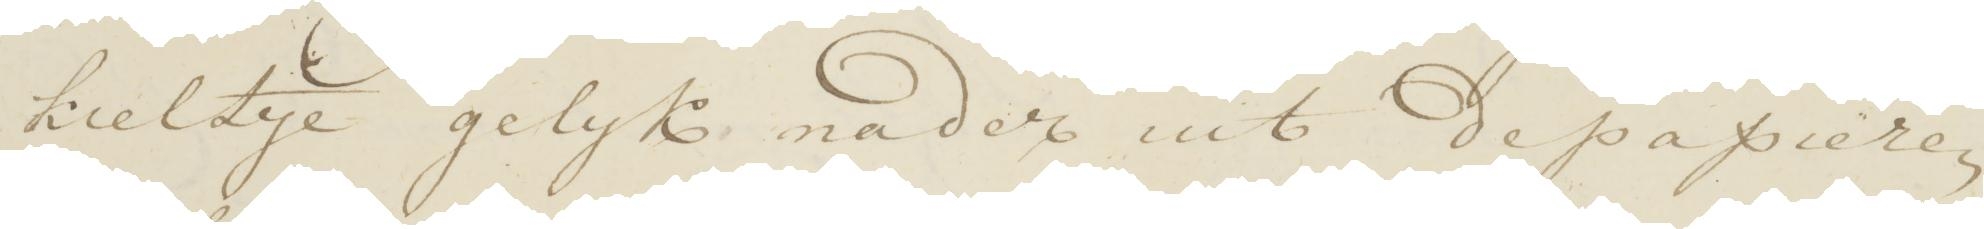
kieltye gelyk, nader uit de papieren
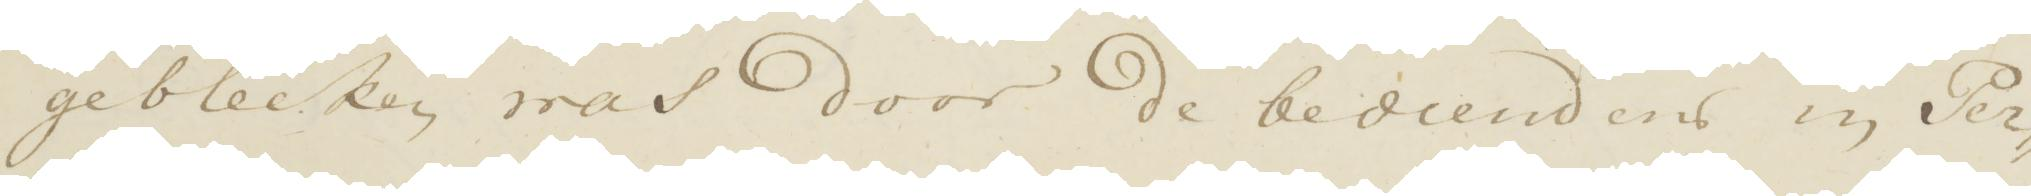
gebleeken was door de bediendens in Per
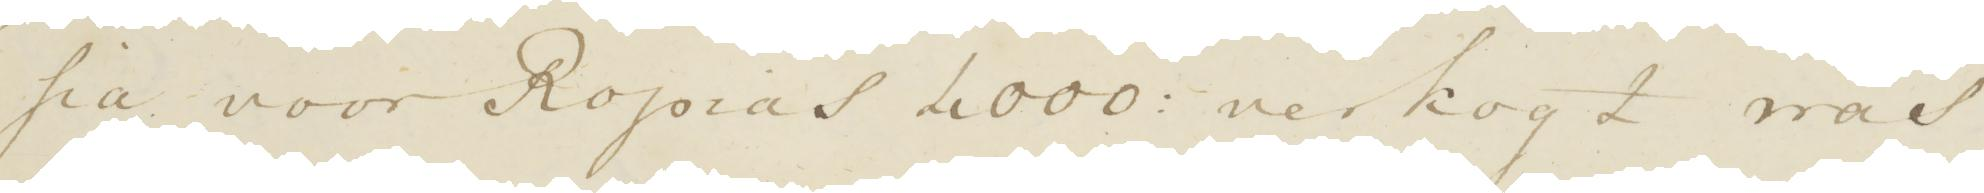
sia voor Ropias 4000: verkogt was
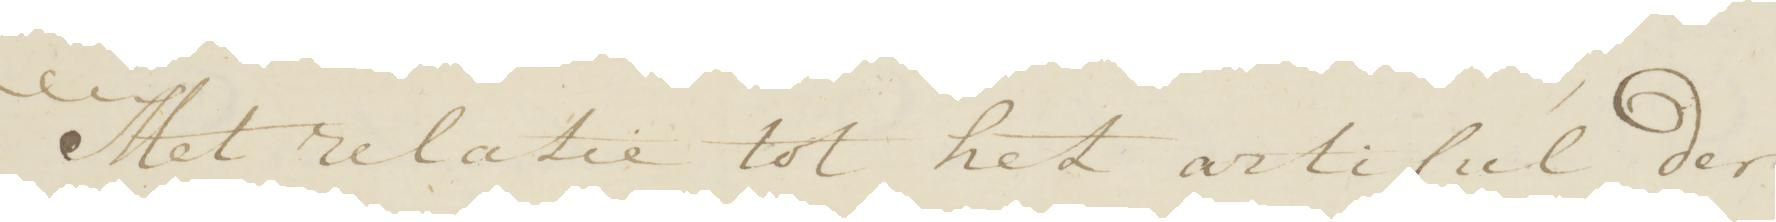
Met relatie tot het articul der
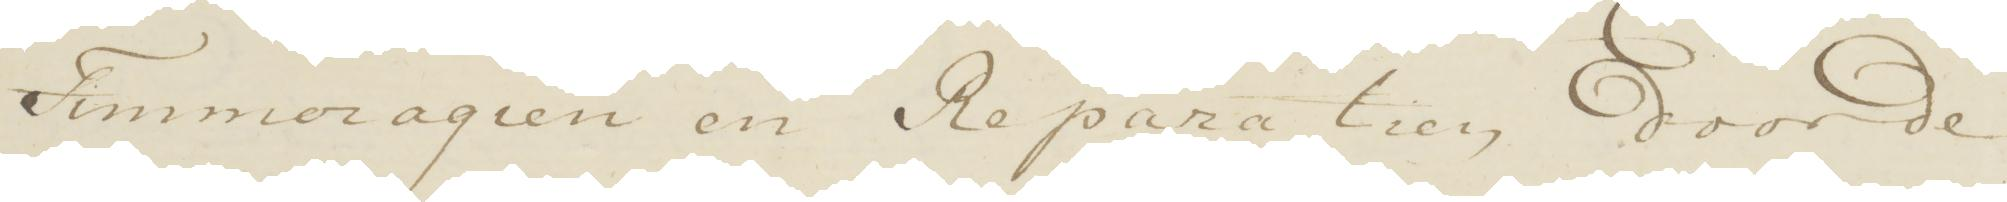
Timmeragien en Reparatien door de
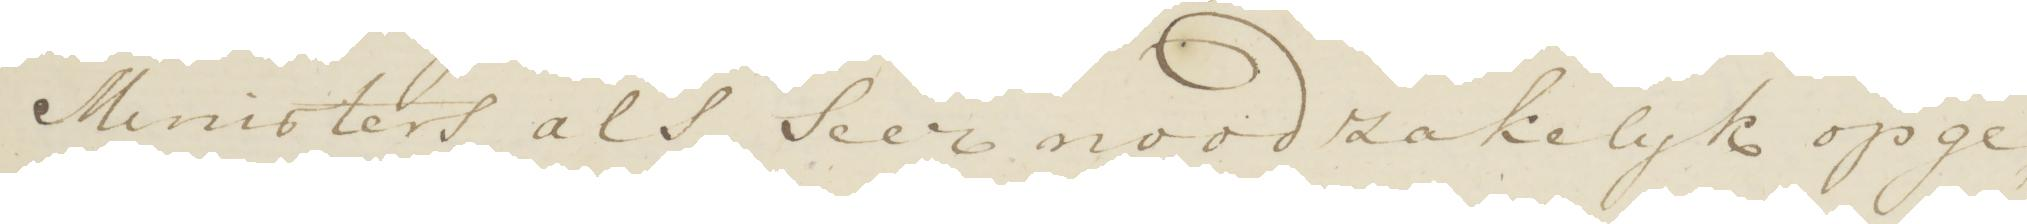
Ministers als seer nood zakelyk opge„
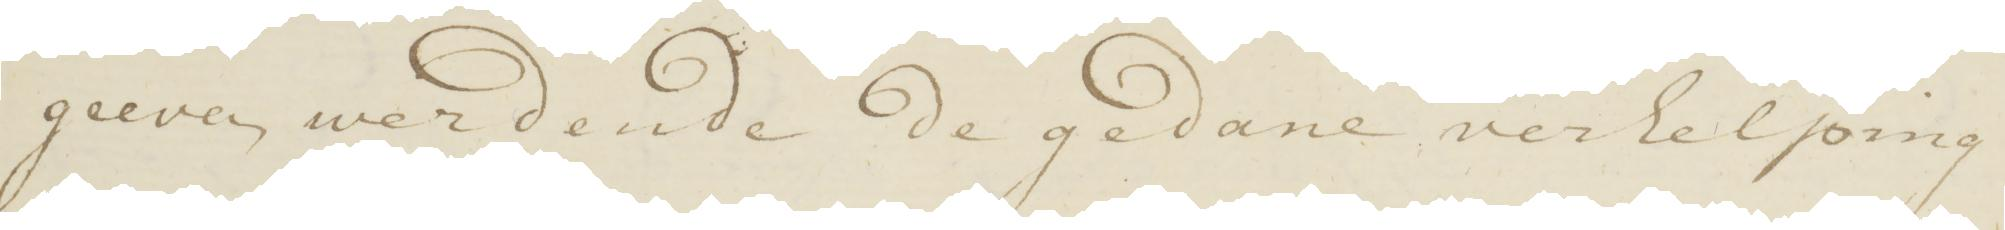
geeven werdende de gedane verhelping
